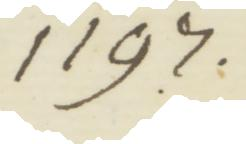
1197.
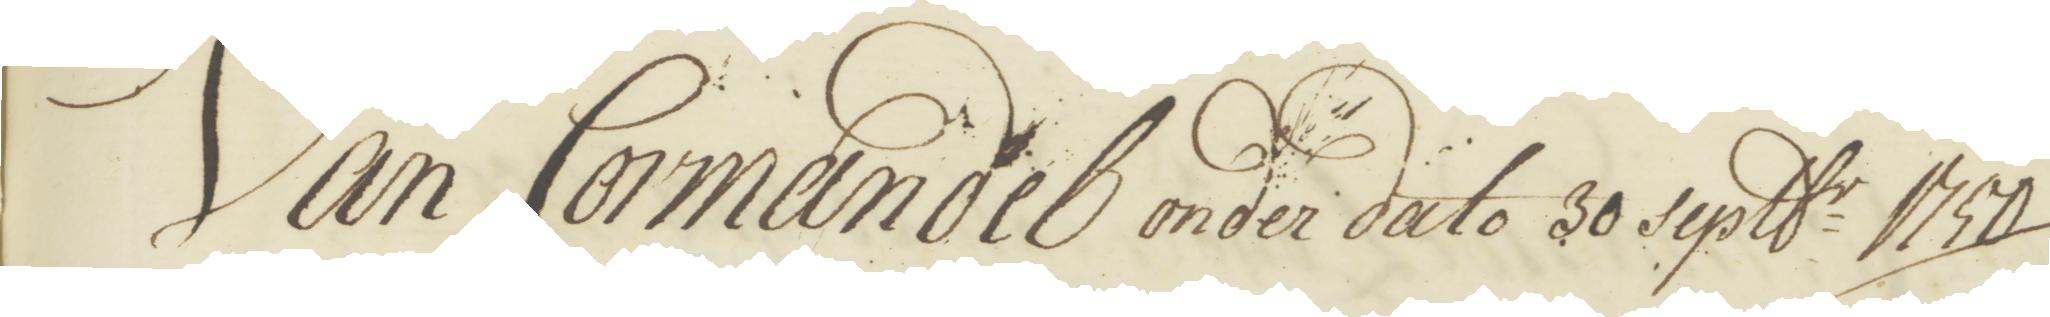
Van Cormandel onder dato 30 septb=r 1750
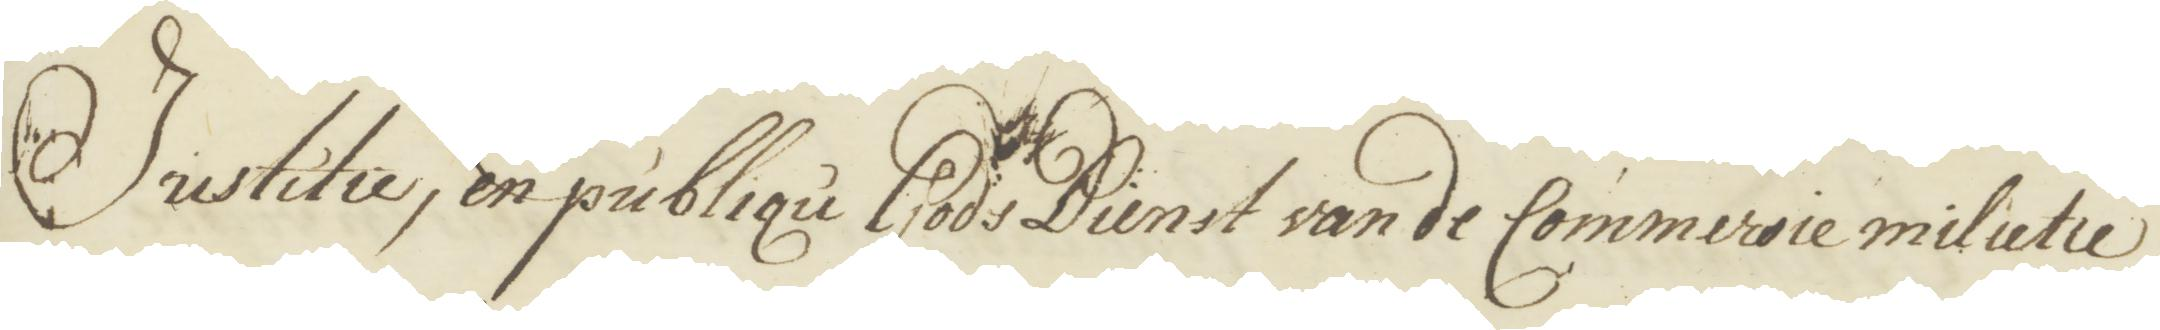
Justitie, en publiqu Gods Dienst van de Commersie milietie
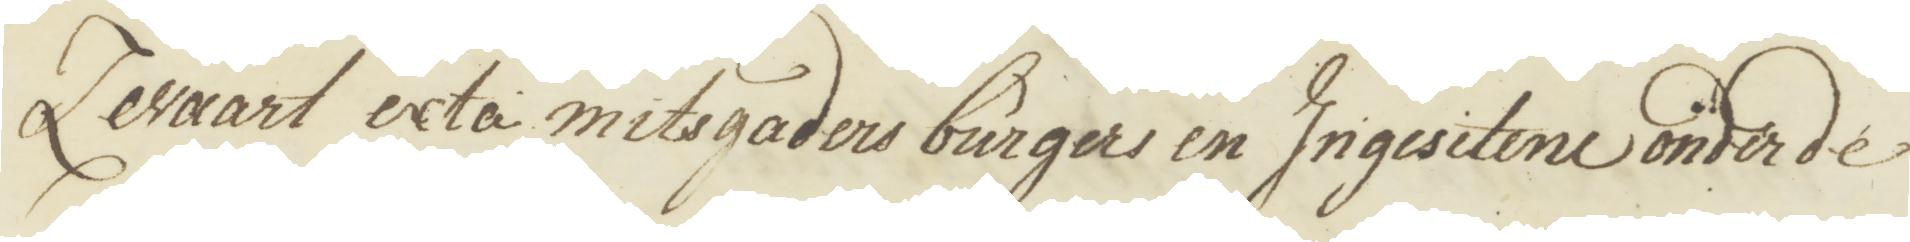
Zevaart exta mitsgaders burgers en Jngesitene onder de
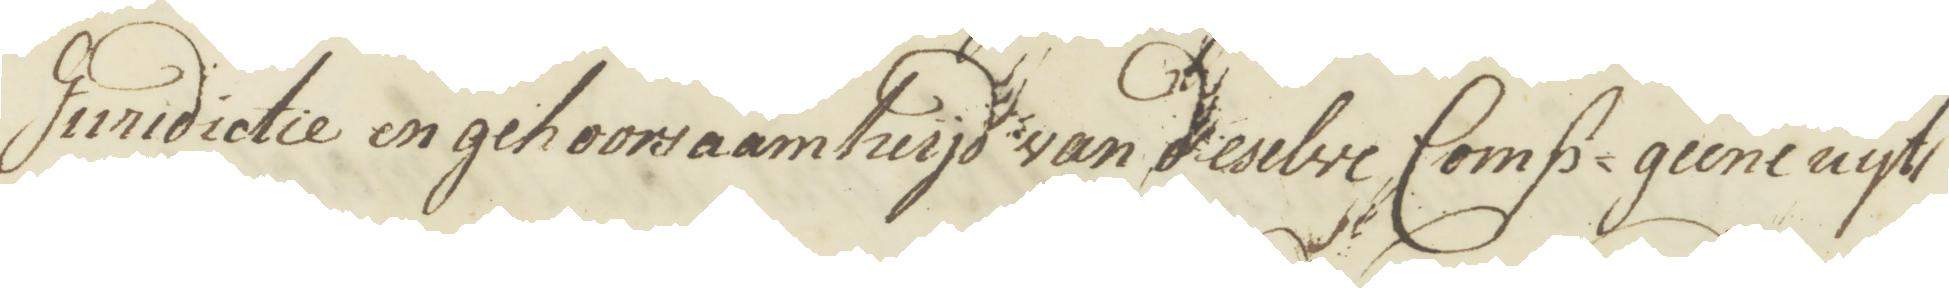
Juridictie en gehoorsaamheijd van deselve Comp=s geene uijt
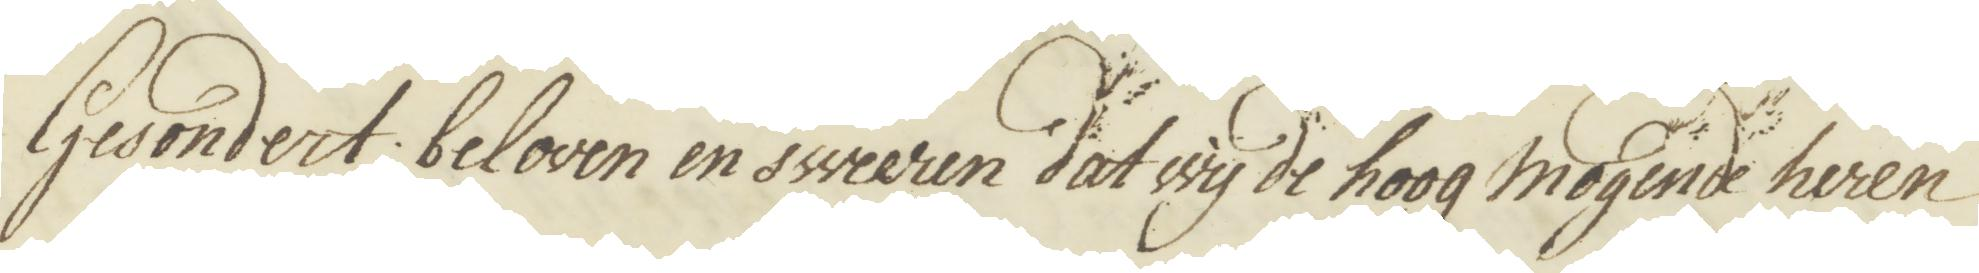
Gesondert beloven en sweeren dat wij de hoog mogende heren
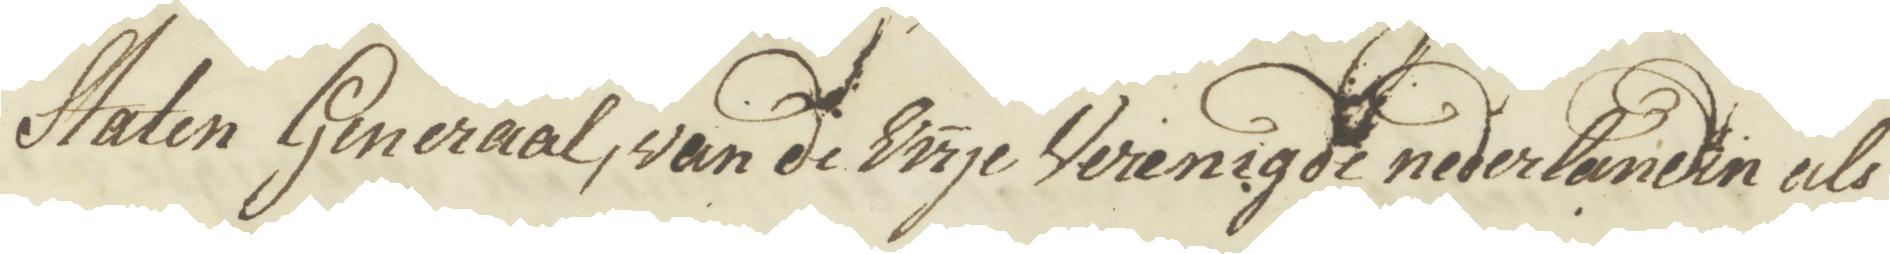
Staten Generaal, van de vrije Verenigde nederlanden als
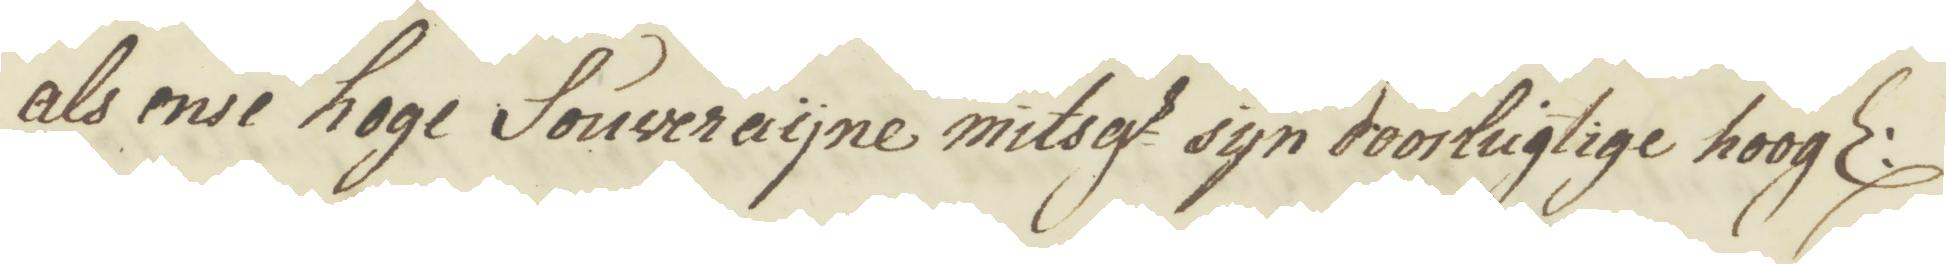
als onse hoge souveraijne mitsg=s sijn doorlugtige hoog E:
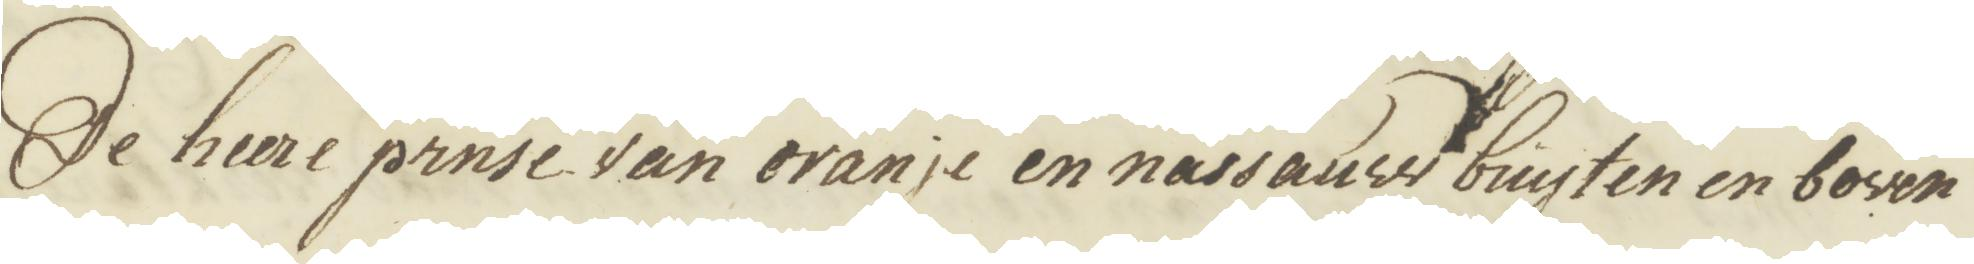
De heere prinse van oranje en nassauw buijten en boven
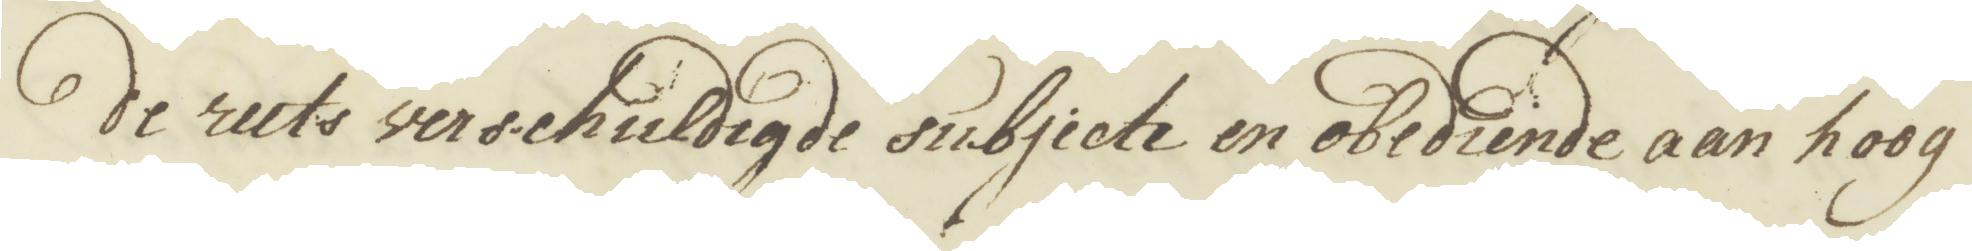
de reets verschuldigde subjecte en obediende aan hoog
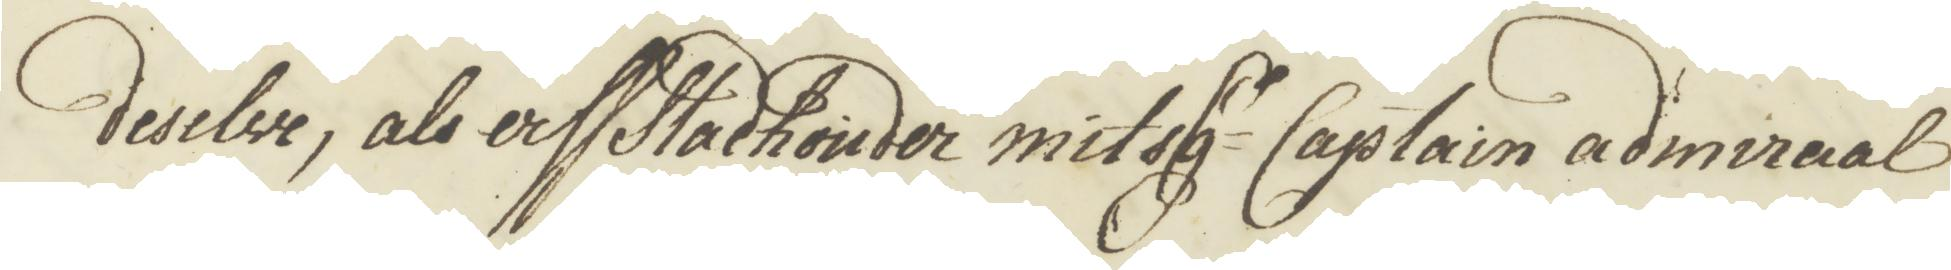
deselve, als erff Stadhouder mitsg=s Captain admiraal
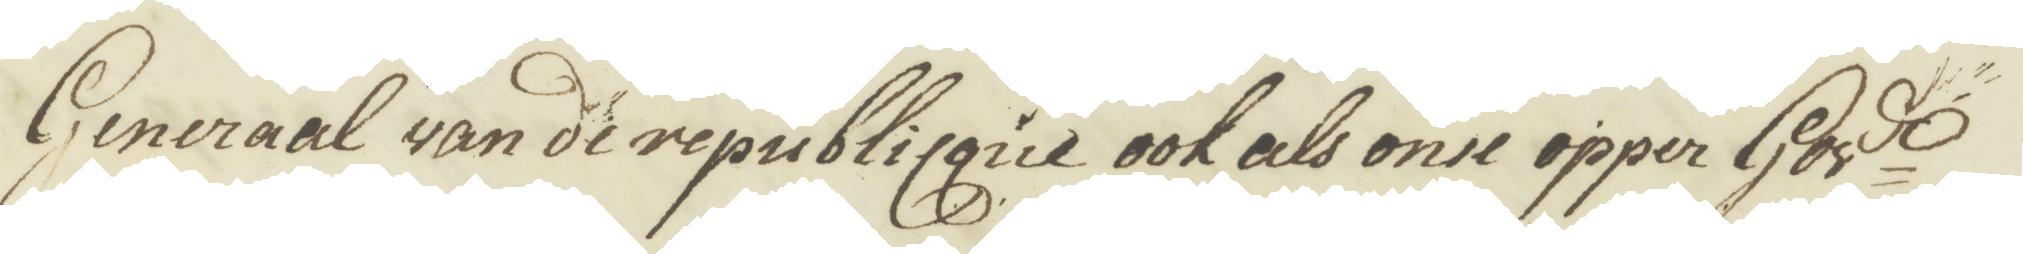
Generaal van de republicque ook als onse opper Gov=
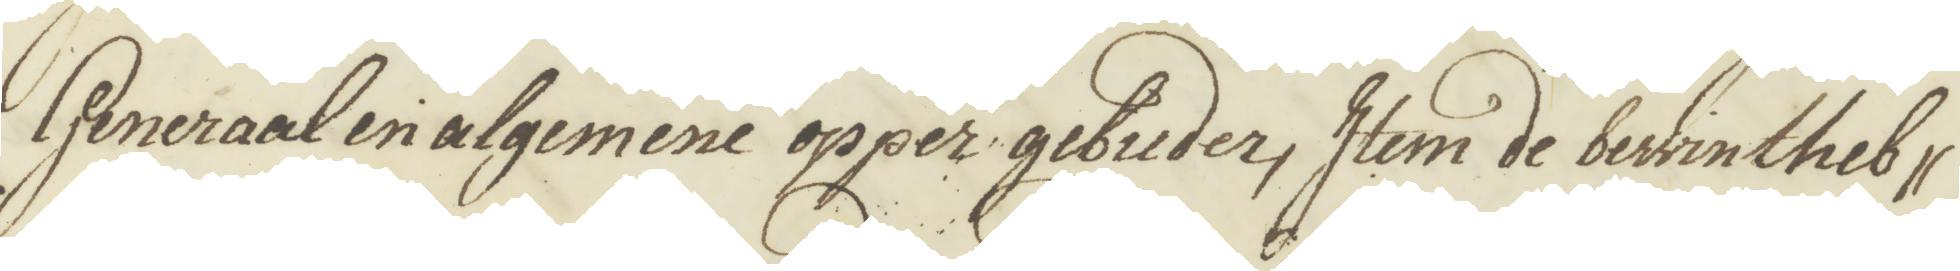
Generaal en algemene opper gebieder, Item de bewintheb„
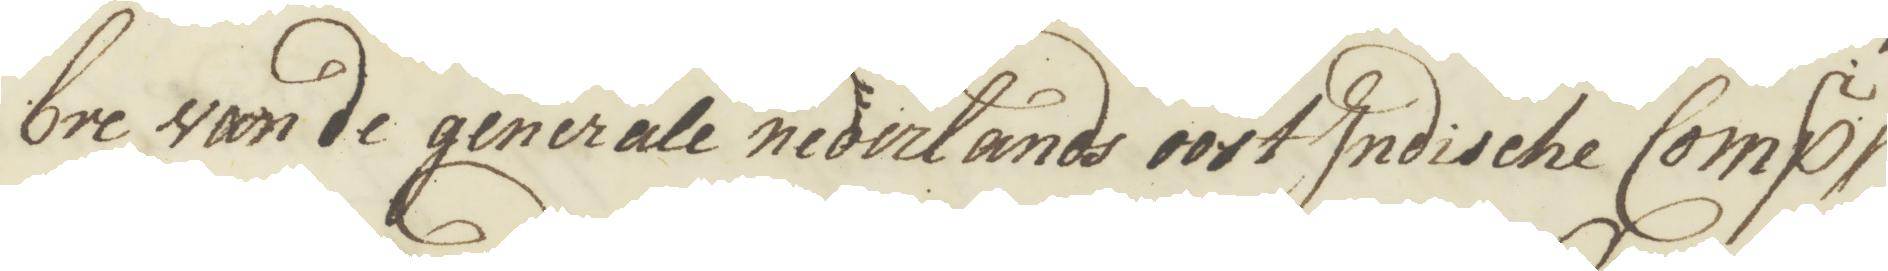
bre van de generale nederlands oost Jndische Comp
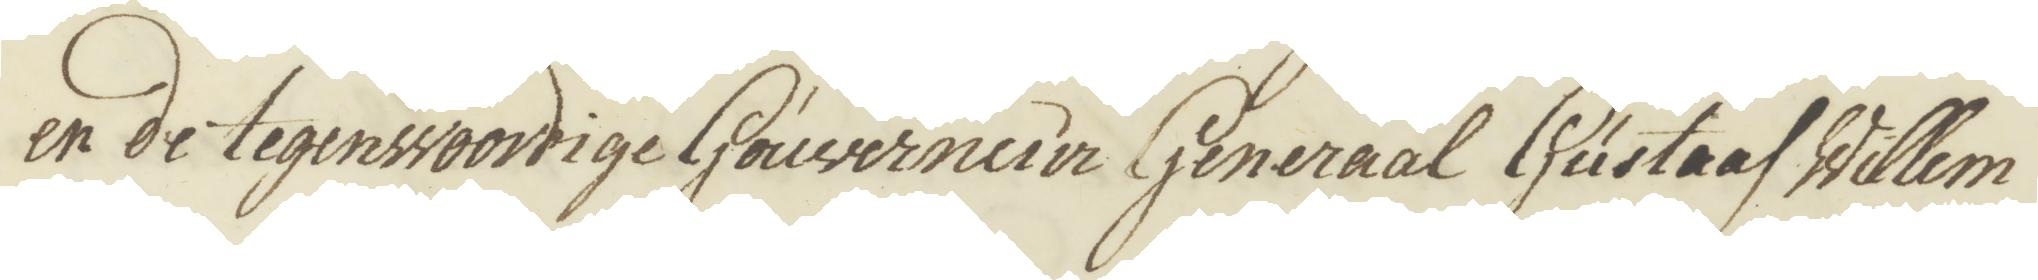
en de tegenwoordige Gouverneur Generaal Gustaaf Willem
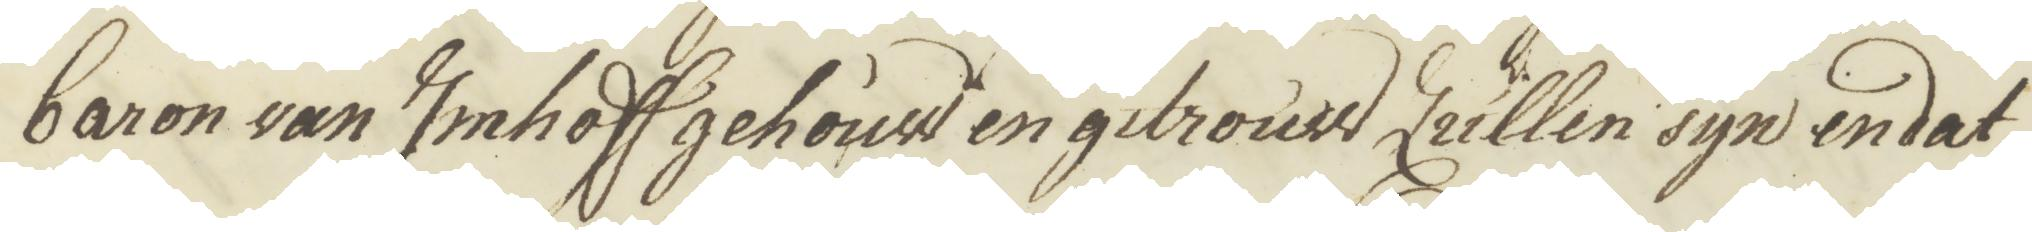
baron van Imhoff gehouw en getrouw zullen sijn en dat
